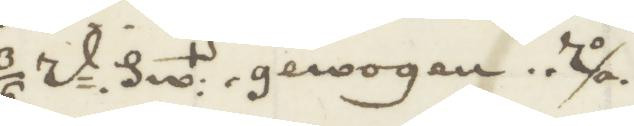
r=l sw:te - gewogen . . ro/a
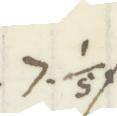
7. 1/5
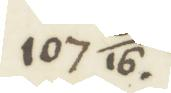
107 3/16.
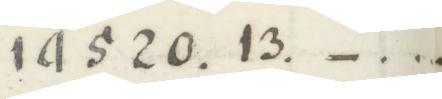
14520. 13.-
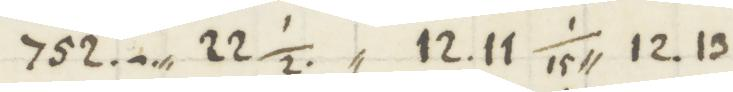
752.-,„ 22½. „ 12.11 1/15„ 12.13
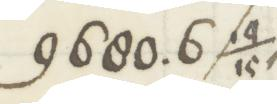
9680.6 14/15„
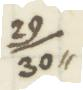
29/30„
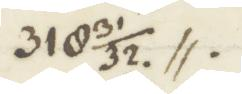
318 31/32. „.
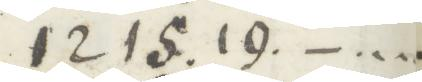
1215.19.-
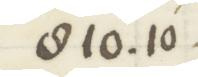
810.10.
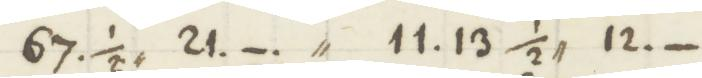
67.½„ 21.–. „ 11.13 ½„ 12.-
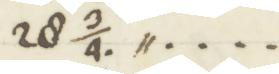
28 3/4. „ . . .
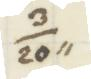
3/20„
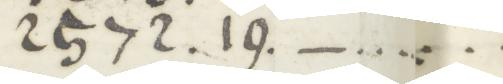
2572.19.-
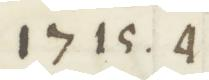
1715.4
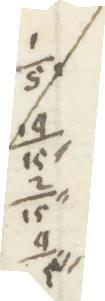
4/5„
